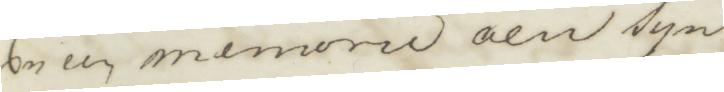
En een memorie aen syn
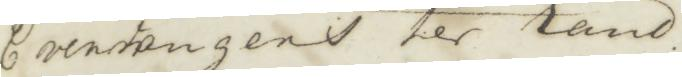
Evenhangers ter hand
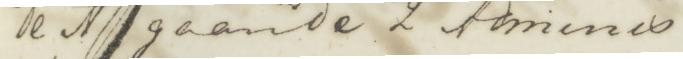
de Afgaande 2 Adminis
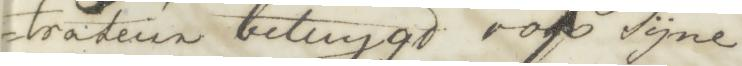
„trateur betuygd ook sijne
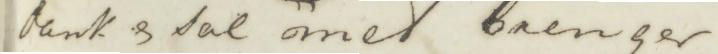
dank en sal met brenger
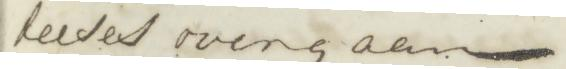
deeses overgaen
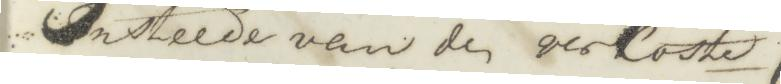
Insteede van den verloste
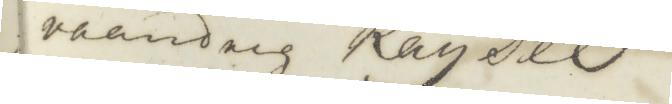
vaandrig Kaysel
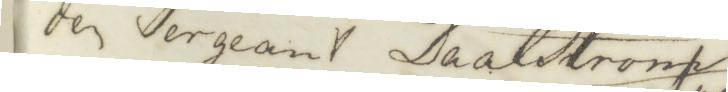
den sergeant Daalstrom
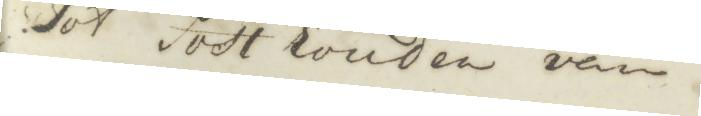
Tot Post houder van
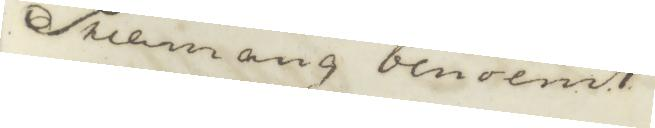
Priamang benoemt
